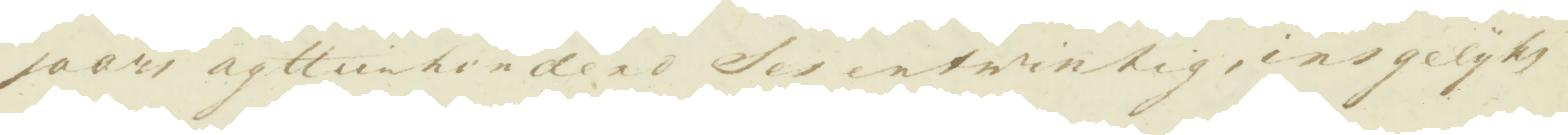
jaars agttienhonderd ses entwintig, insgelijks
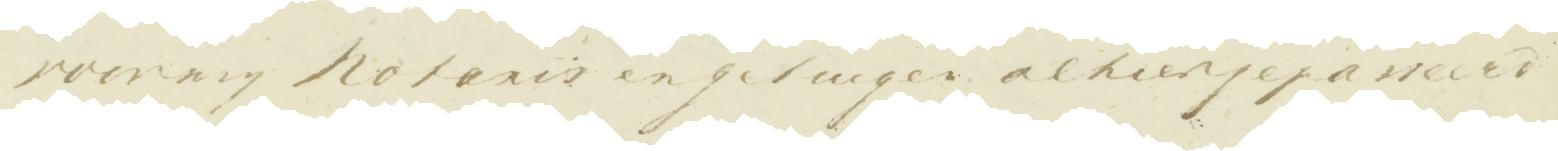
voor mij Notaris en getuigen alhier gepasseerd
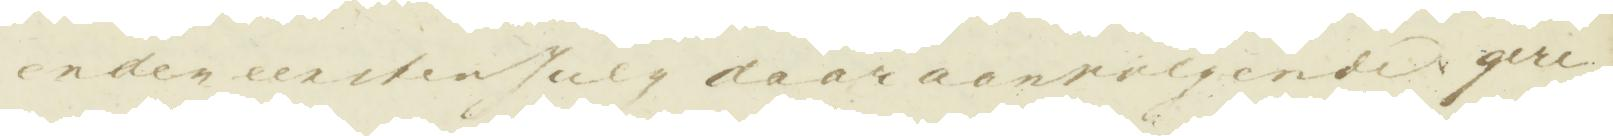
en den eersten July daaraanvolgende gere
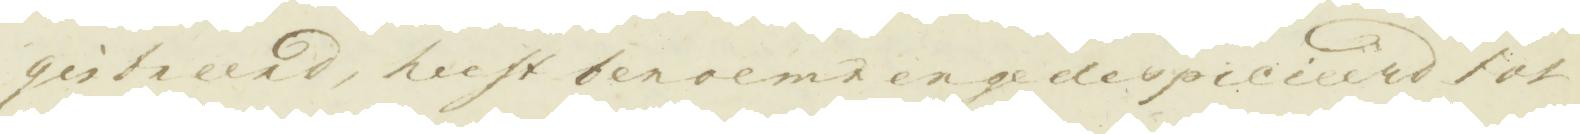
gistreerd, heeft benoemd en gedespecieerd tot
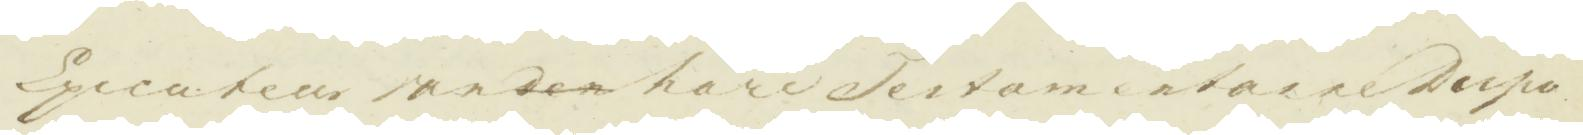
Executeur van den hare Testamentaire Dispo
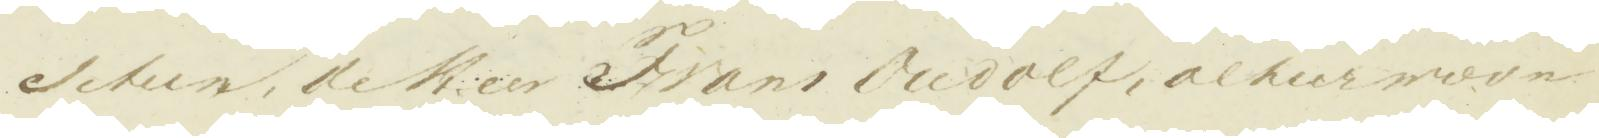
sitien, de Heer Frans Oudolf, alhier woon
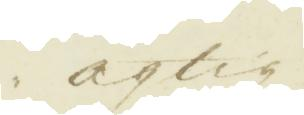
„agtig
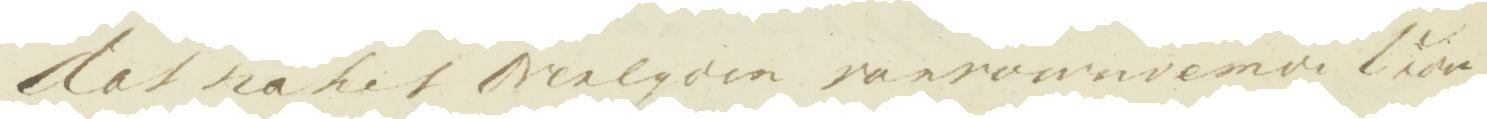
dat na het overlyden van voornoemde Vrou
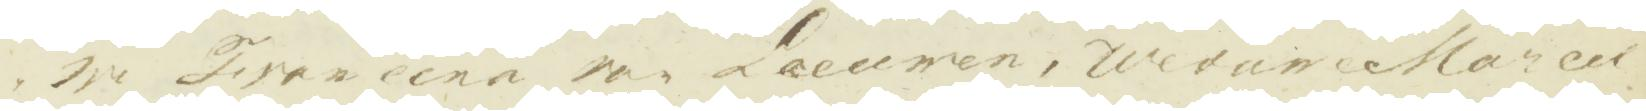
„we Francina van Leeuwen, weduwe Marcel„
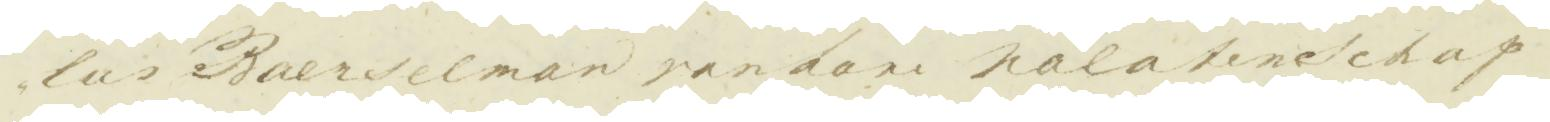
„lus Baerselman van hare nalatenschap
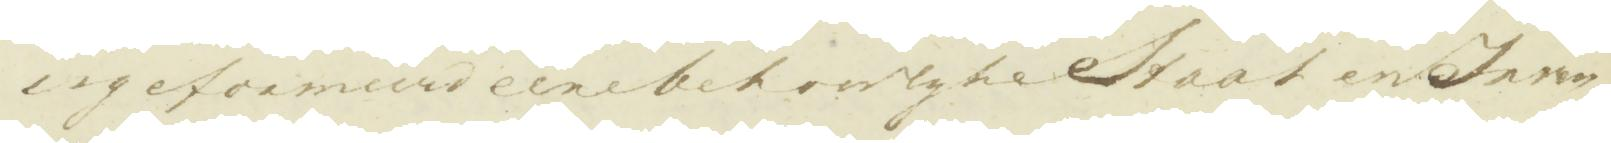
is geformeerd eene behoorlyke Staat en Inven
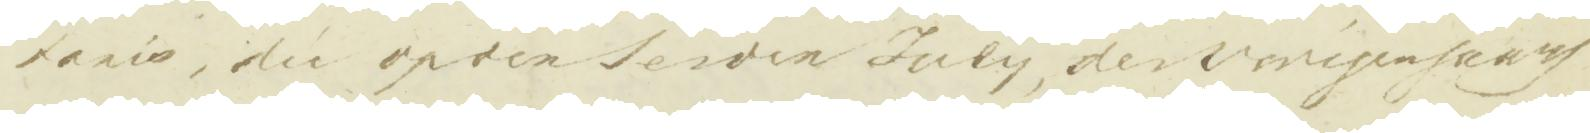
taris, die op den sesden Iuly, des vorigenjaars
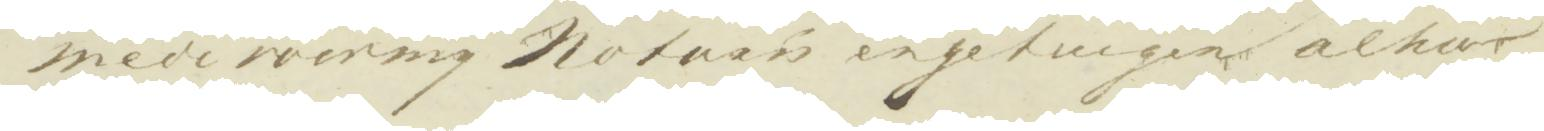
mede voor mij Notaris en getuigen, alhier
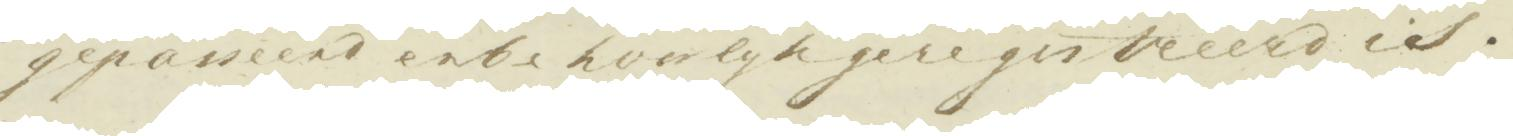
gepasseerd en behoorlyk geregistreerd is.
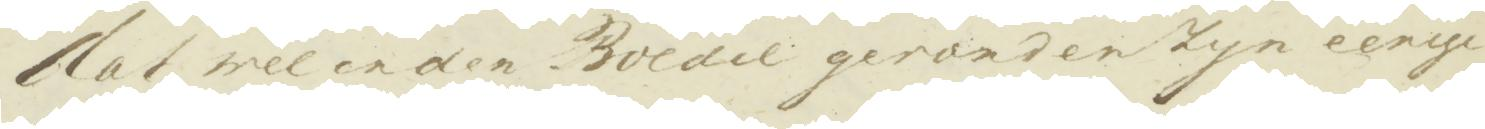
dat wel in den Boedel gevonden zyn eenige
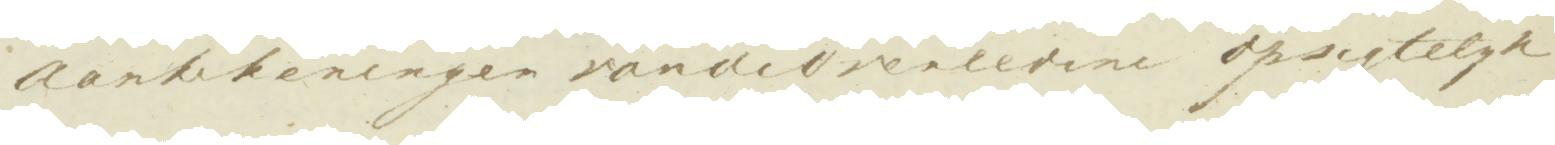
aantekeningen van de overledene opsigtelyk
